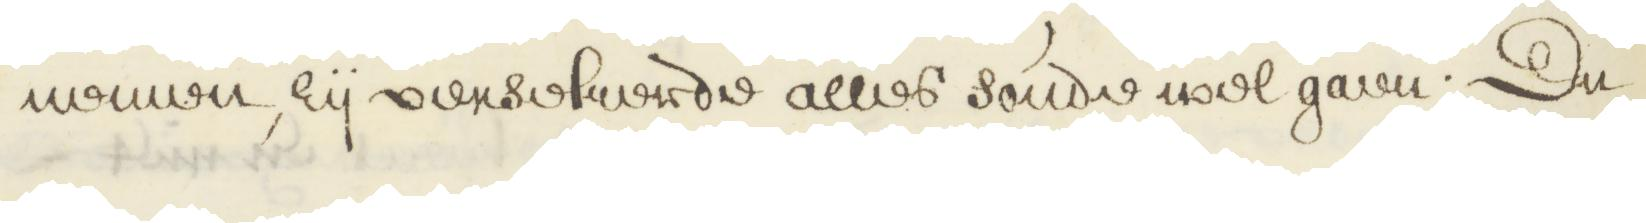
nemen, hij versekerde alles soude wel gaen; En
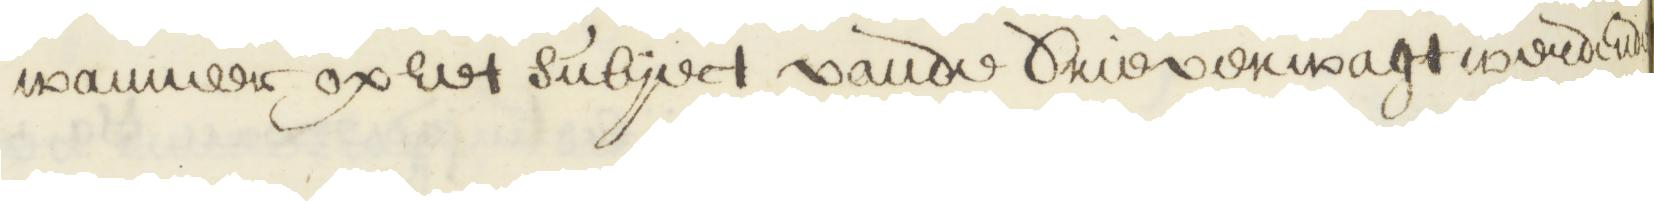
wanneer op het subject vande drieverwagt werdende
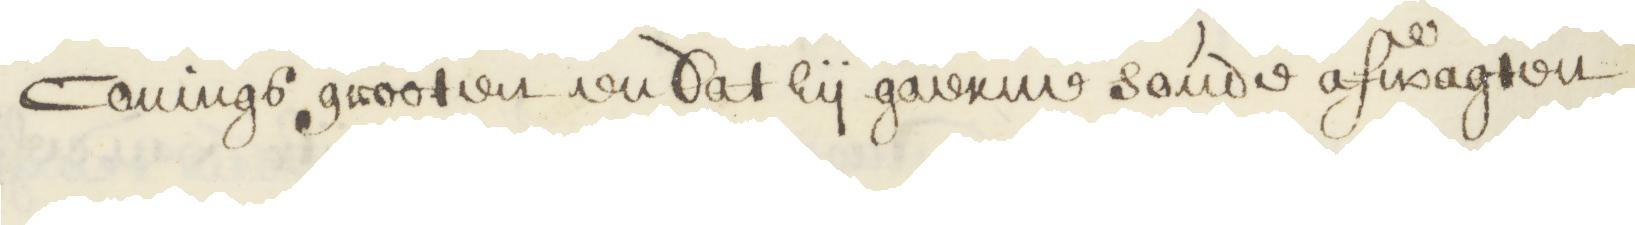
Conings grooten en dat hij gaerne soude afwagten
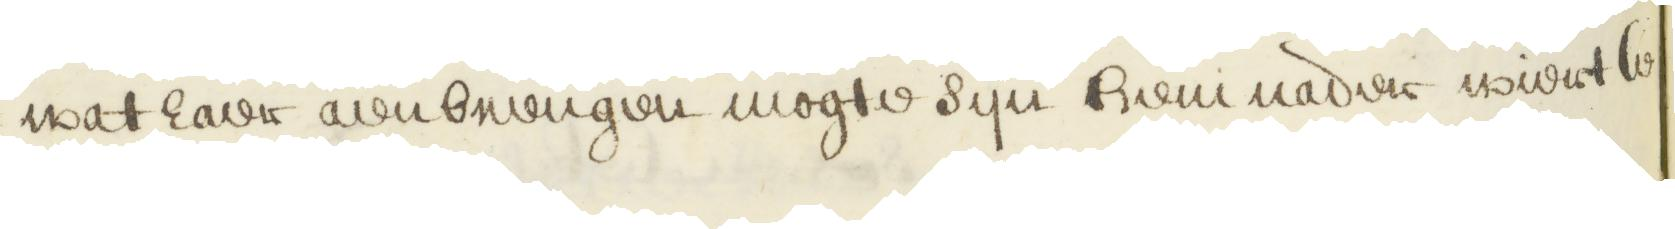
wat haer aenbrengen mogte sijn hem nader wiert te
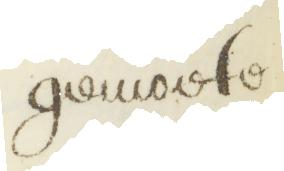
gemoete
